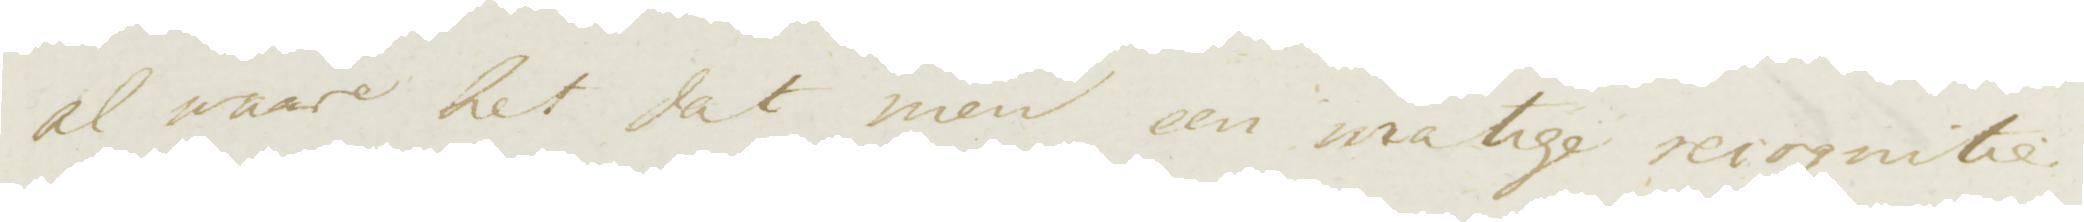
al waare het dat men een matige recognitie
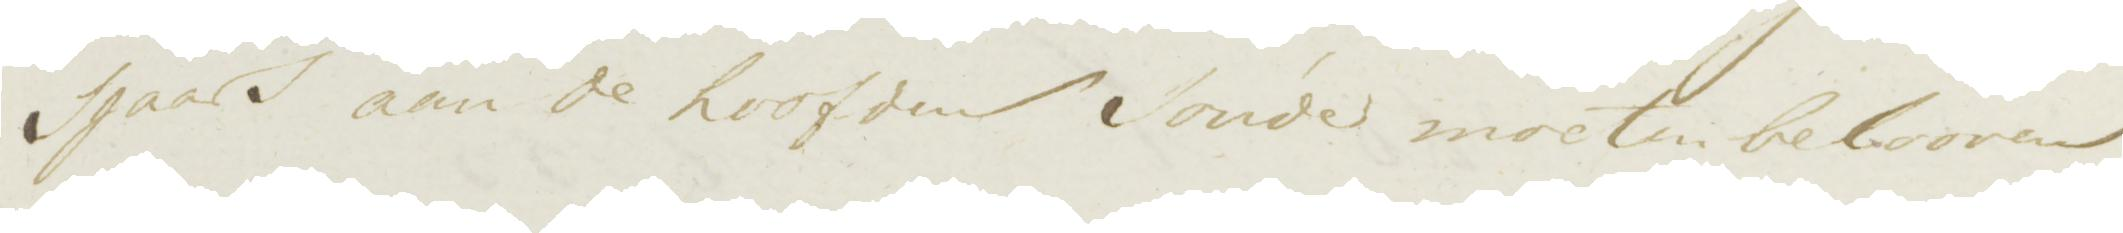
sjaars aan de hoofden soude moeten belooven
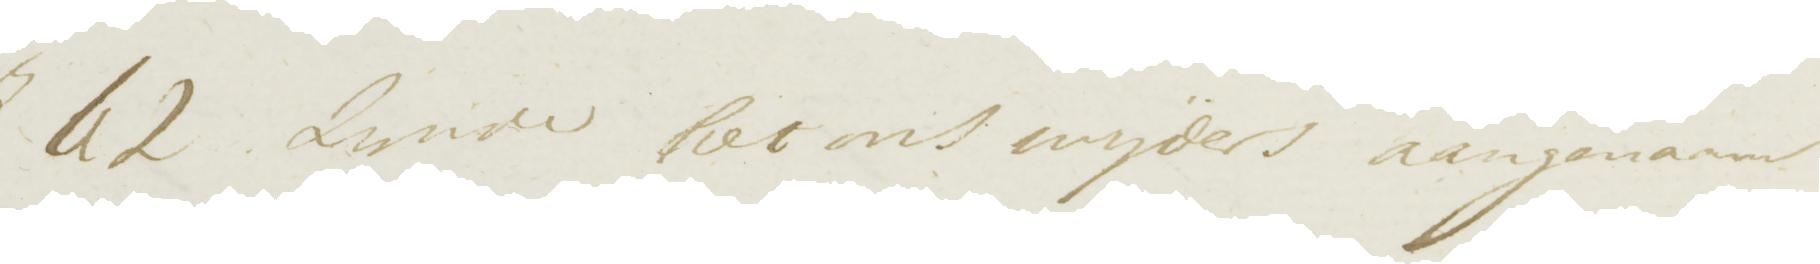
§ 42 Zynde het ons wijders aangenaam
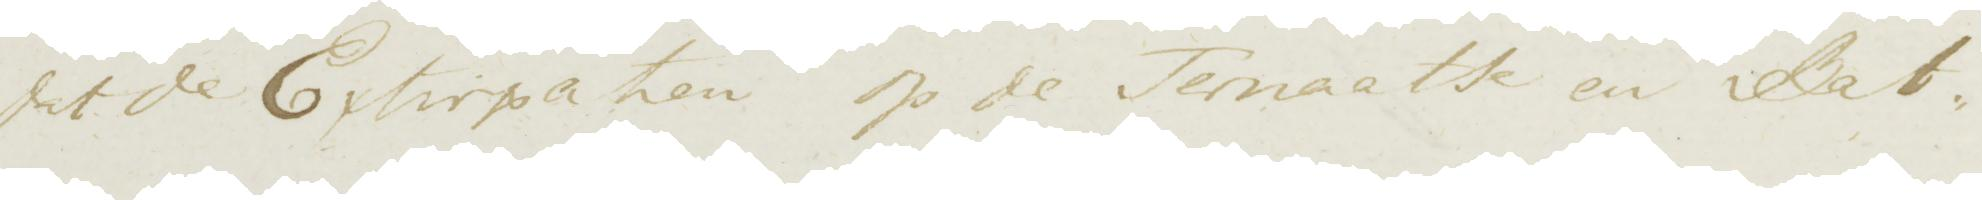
dat de Extirpaten op de Ternaatse en Bat„
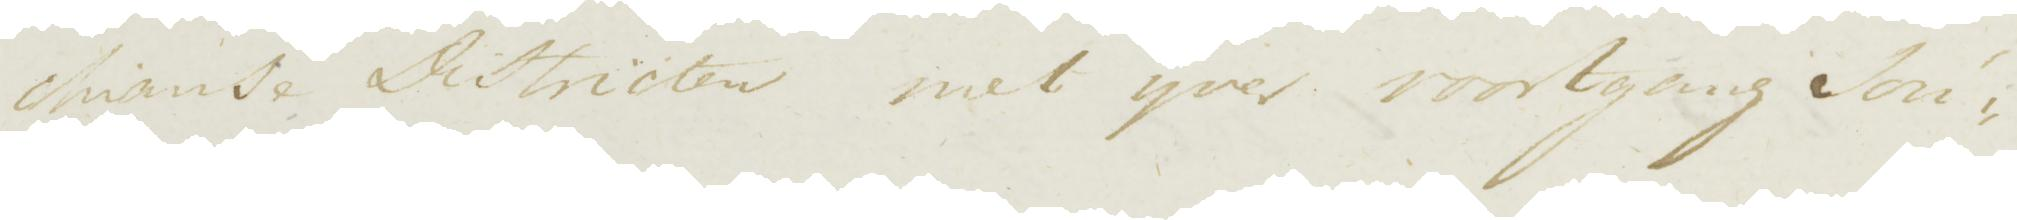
chianse Districten met yver voortgang sou „
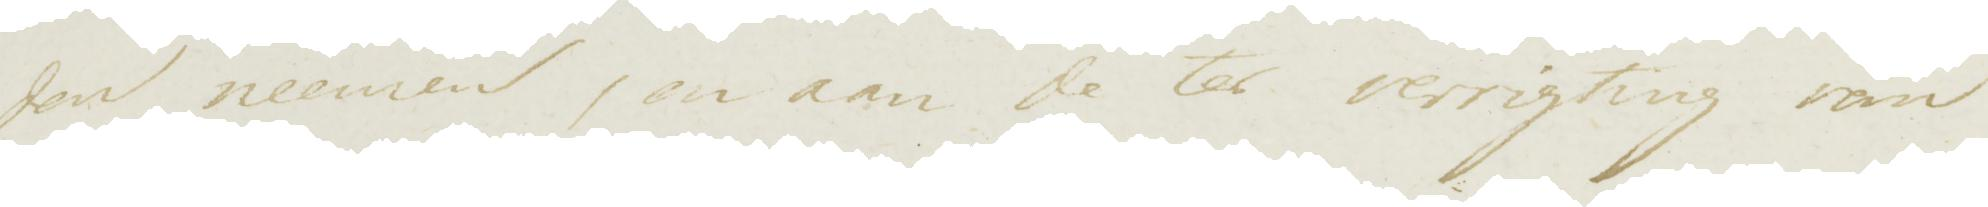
den neemen / en aan de ter verrigting van
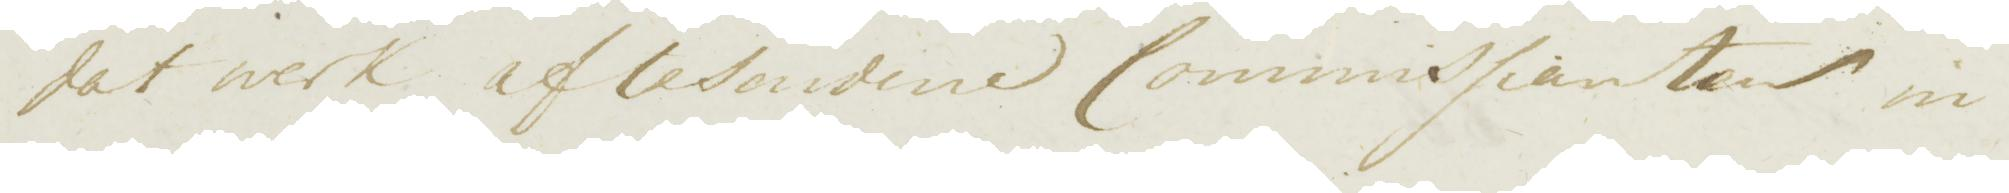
dat werk af tesendene Commissianten in
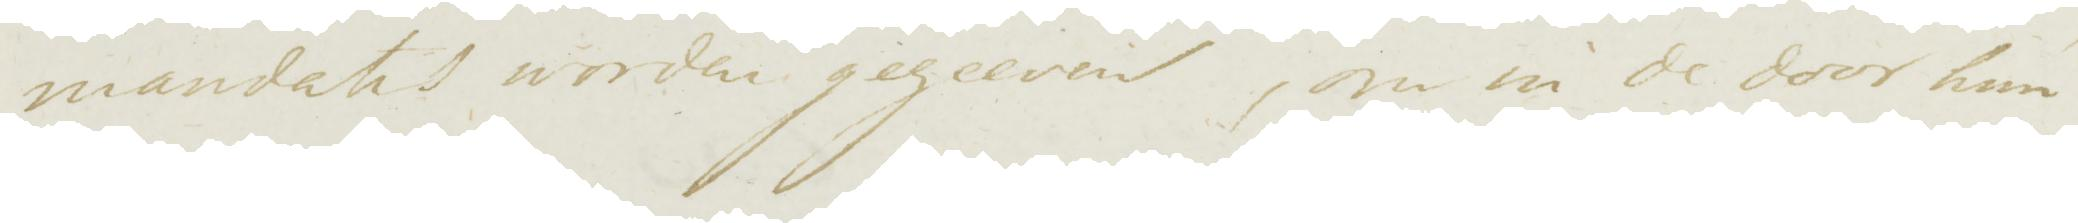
mandatis worden gegeeven , om in de door hun
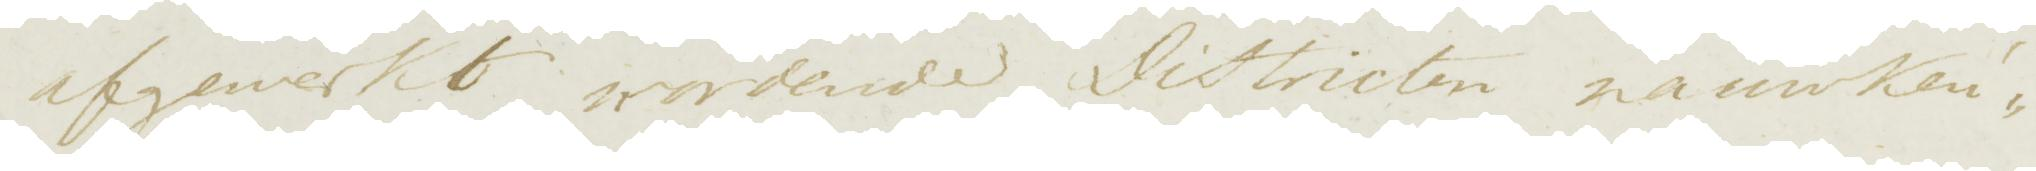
afgewerkt wordende Districten nauwkeu „
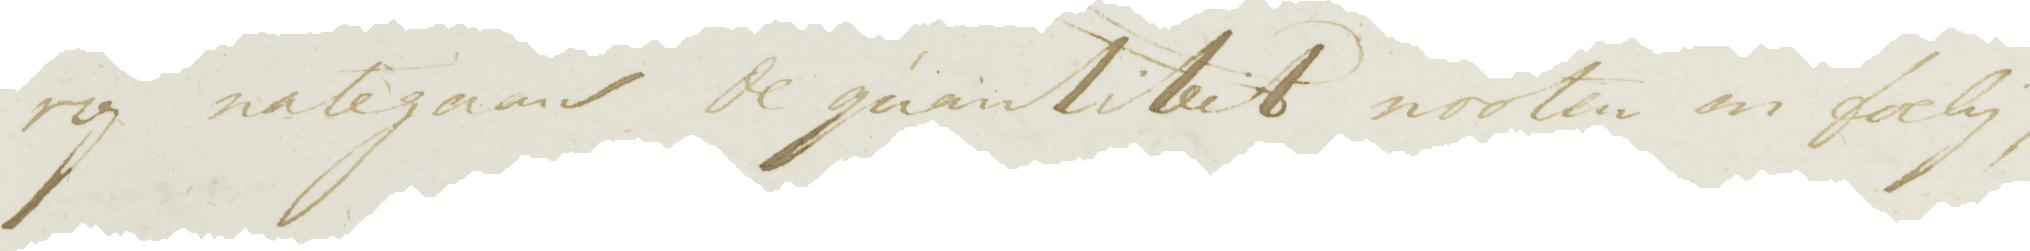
rig nategaan de quantiteit nooten en foely,
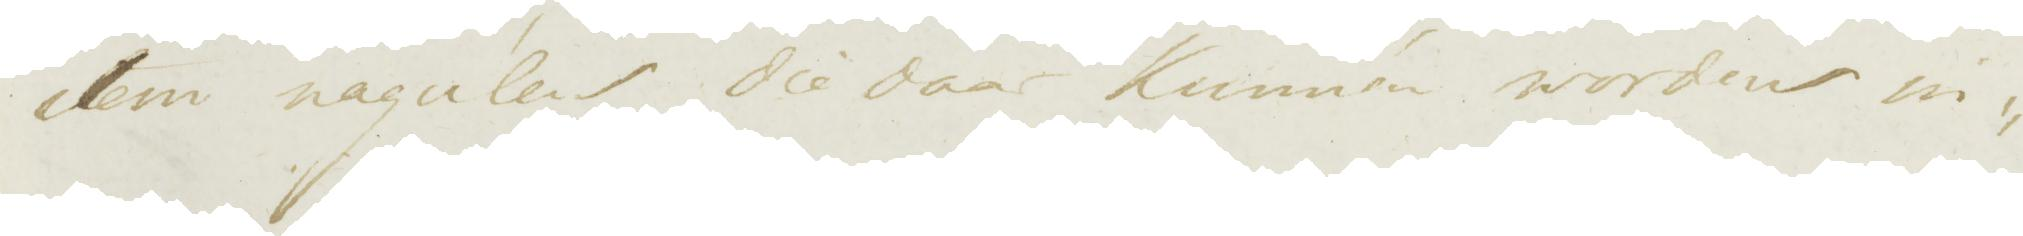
item nagulen die daar kunnen worden in„
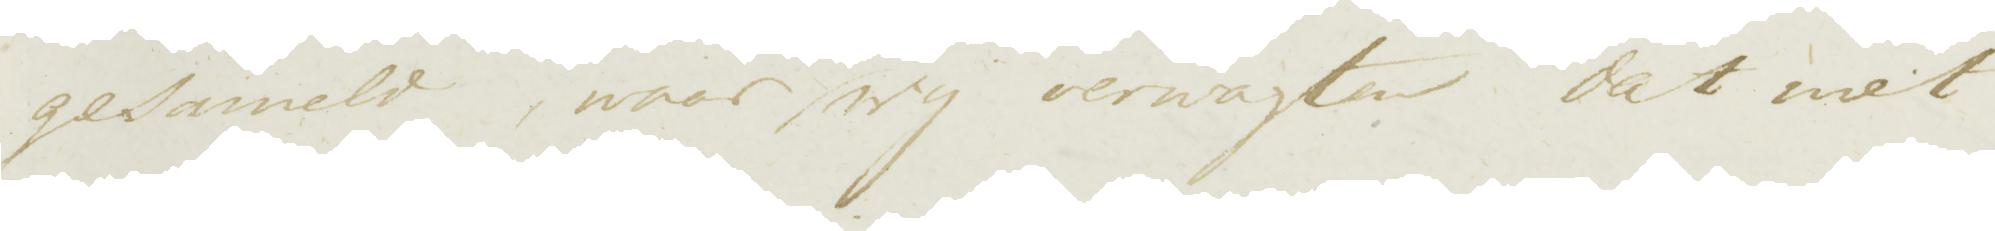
gesameld , waar /wy verwagten dat met
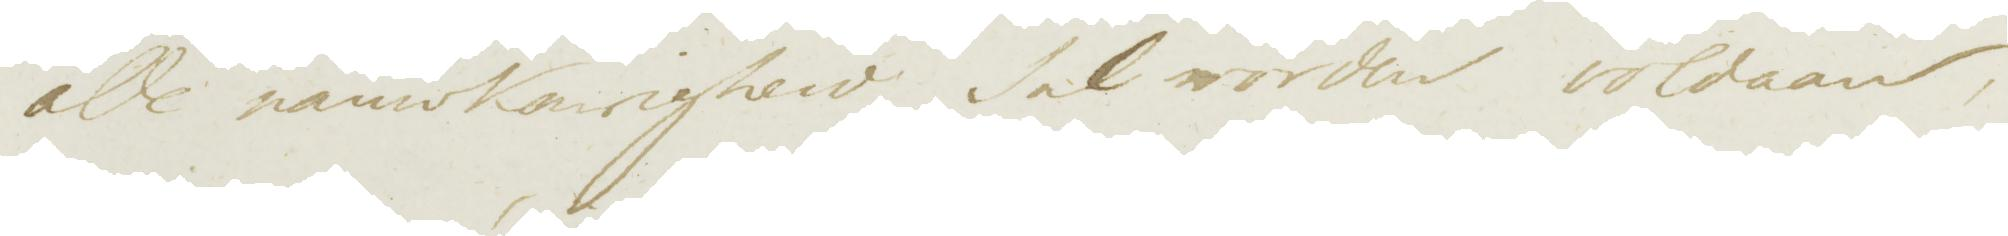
alle nauwkeurigheid sal worden voldaan ,
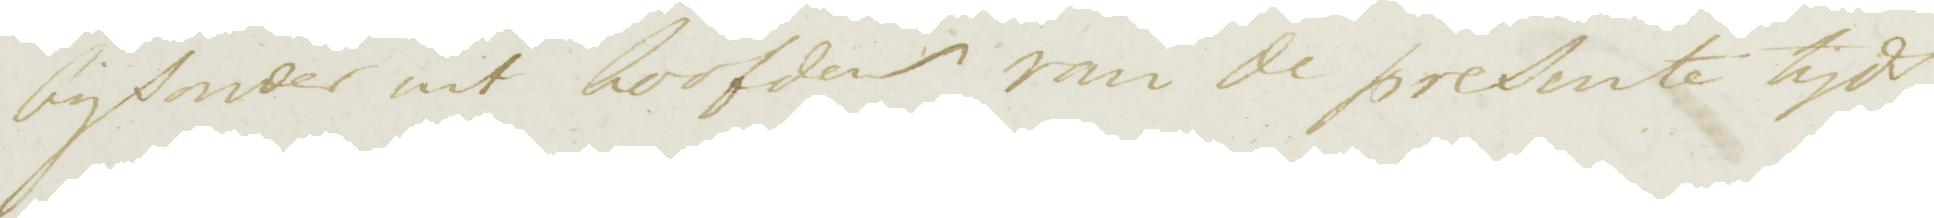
bijsonder uit hoofden van de presente tijds
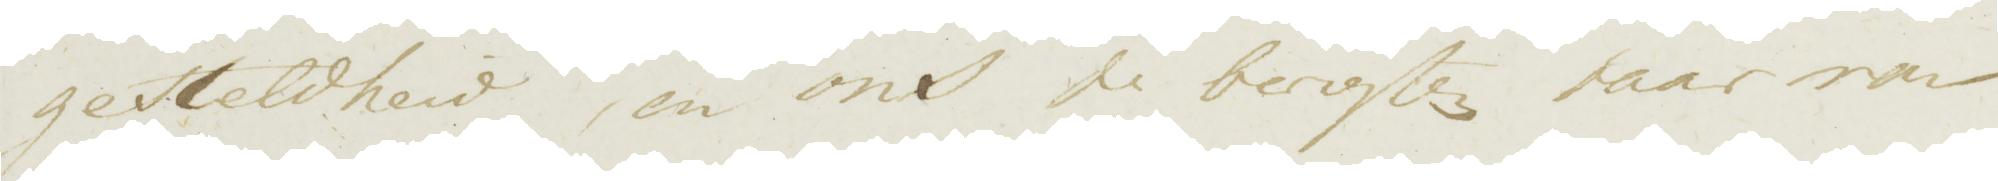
gesteldheid , en ons de berigten daar van
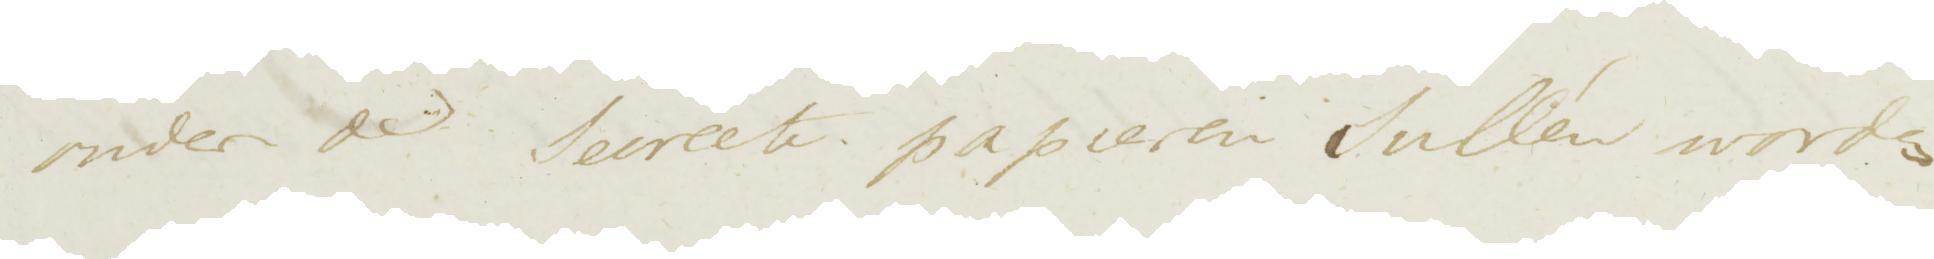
onder de secreete. papieren sullen worden
